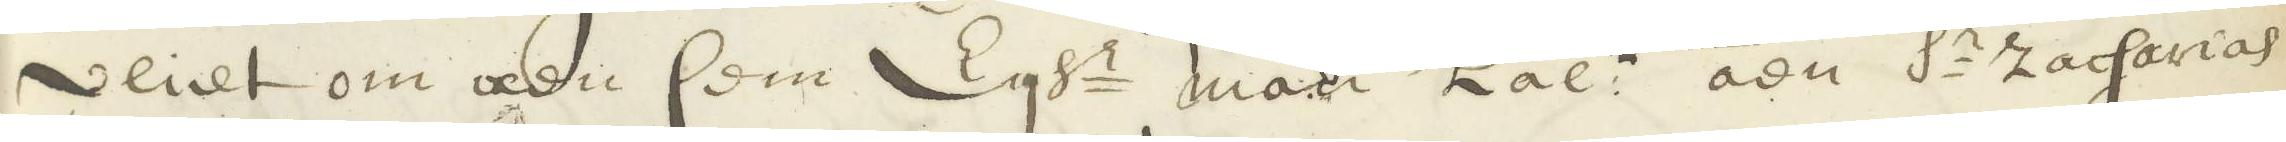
vliet om aen hem Eys=r man zal:r aen s=r zaccarias
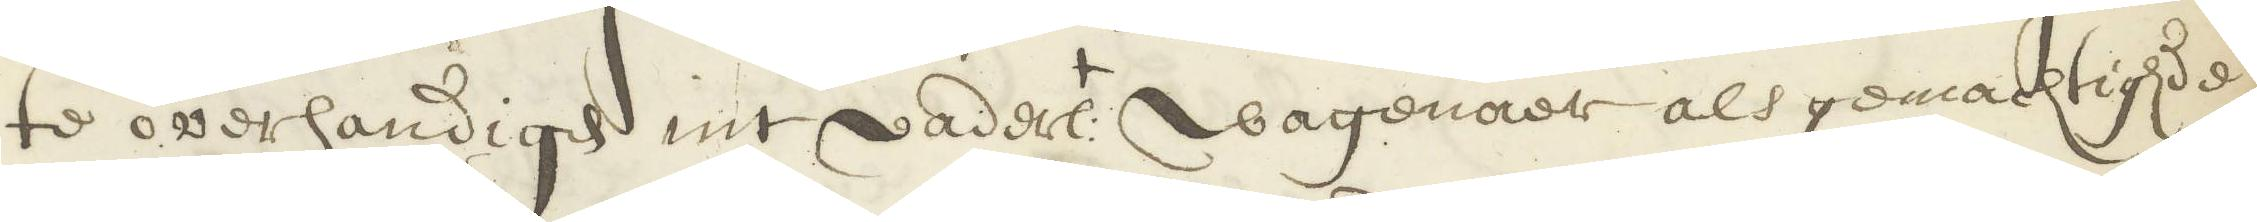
te overhandigen int vaderl:t wagenaer als gemachtighde
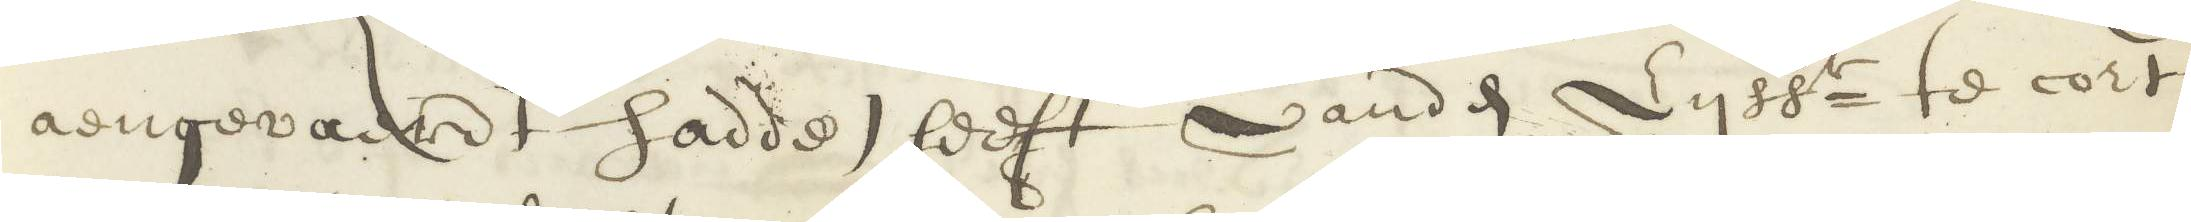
aengevaerdt hadde ) heeft vanden Eyss=r te cort
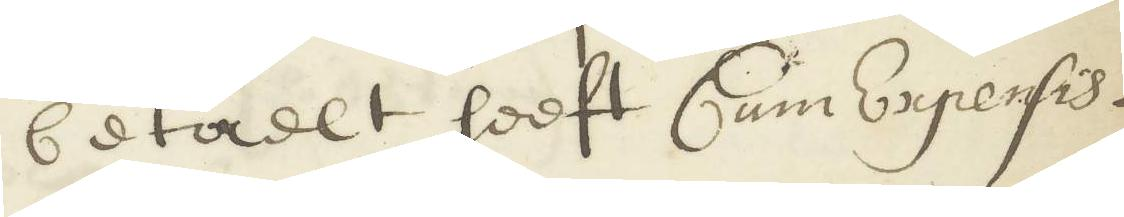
betaelt heeft Cum Expensis.
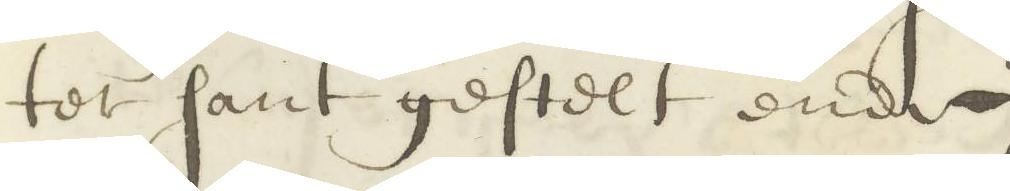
ter hant gestelt ende
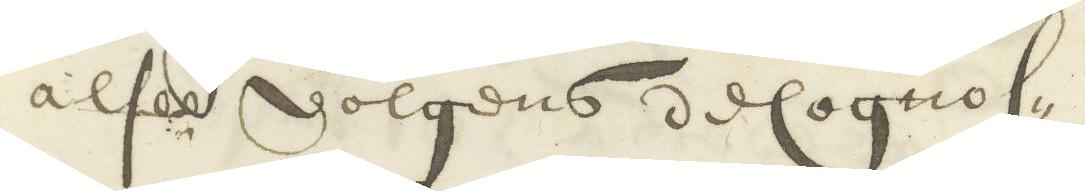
alsoo volgens de Cognos„
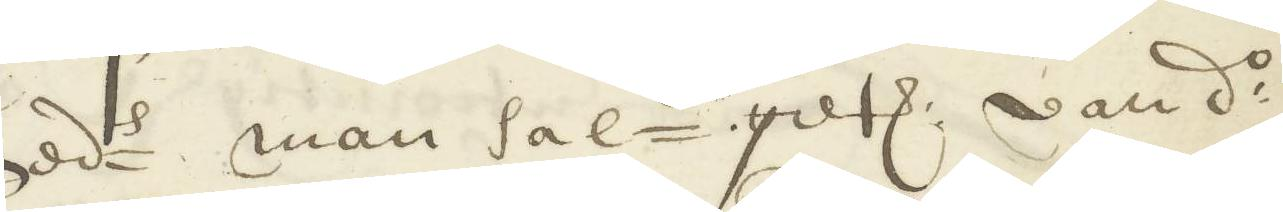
Ged=s man sal=r gete van d:o
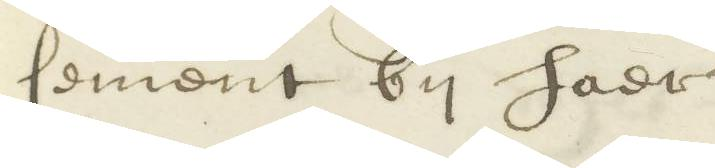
sement bij haer
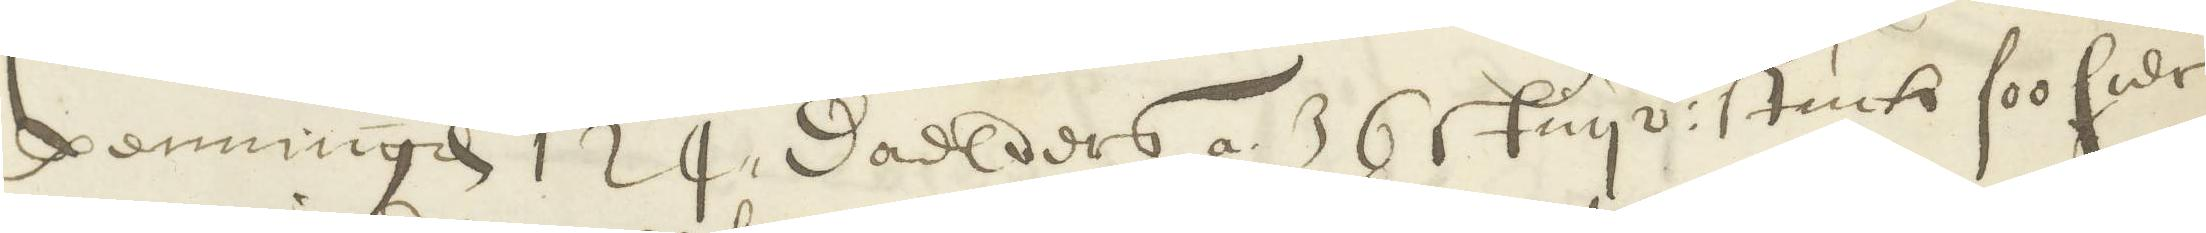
penningen 124 „ Daelders a. 36 stuiju: stuck soo haer
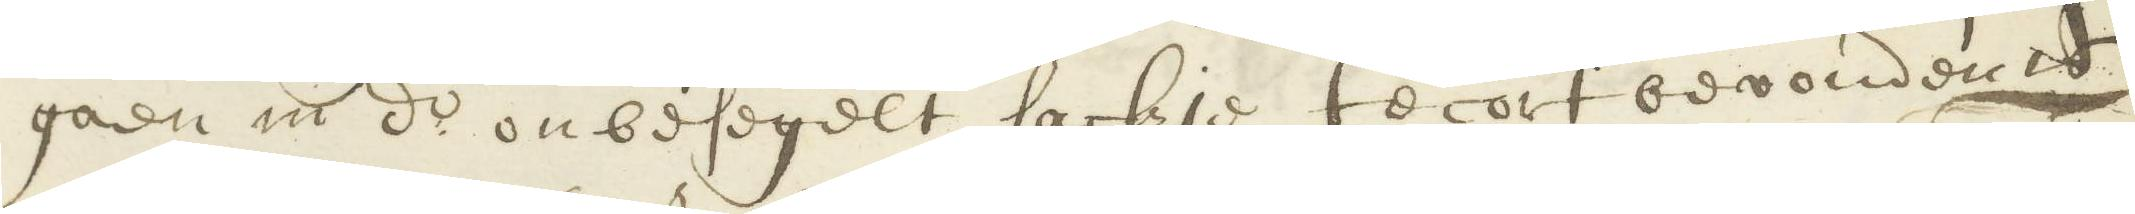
gaen in d:o onbesegelt sackje te cort bevonden is
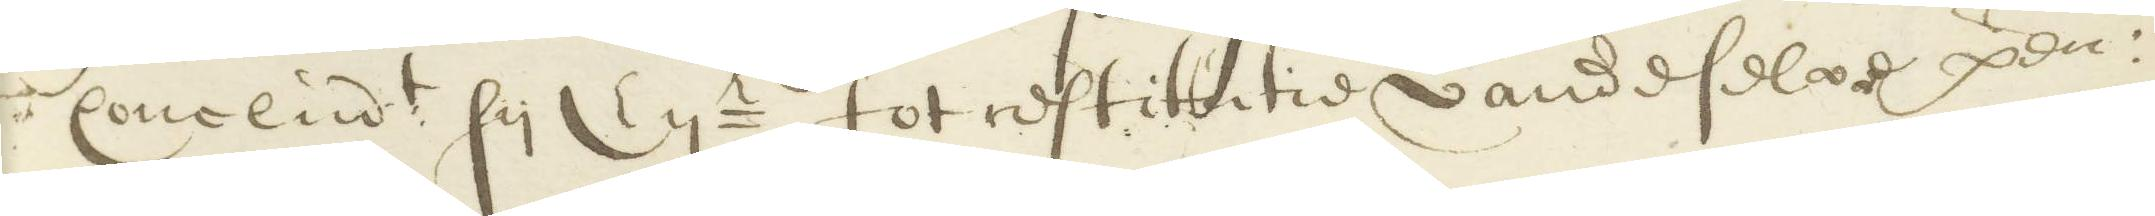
conclud:t sij Ey=r tot restitutie van deselve pen:
